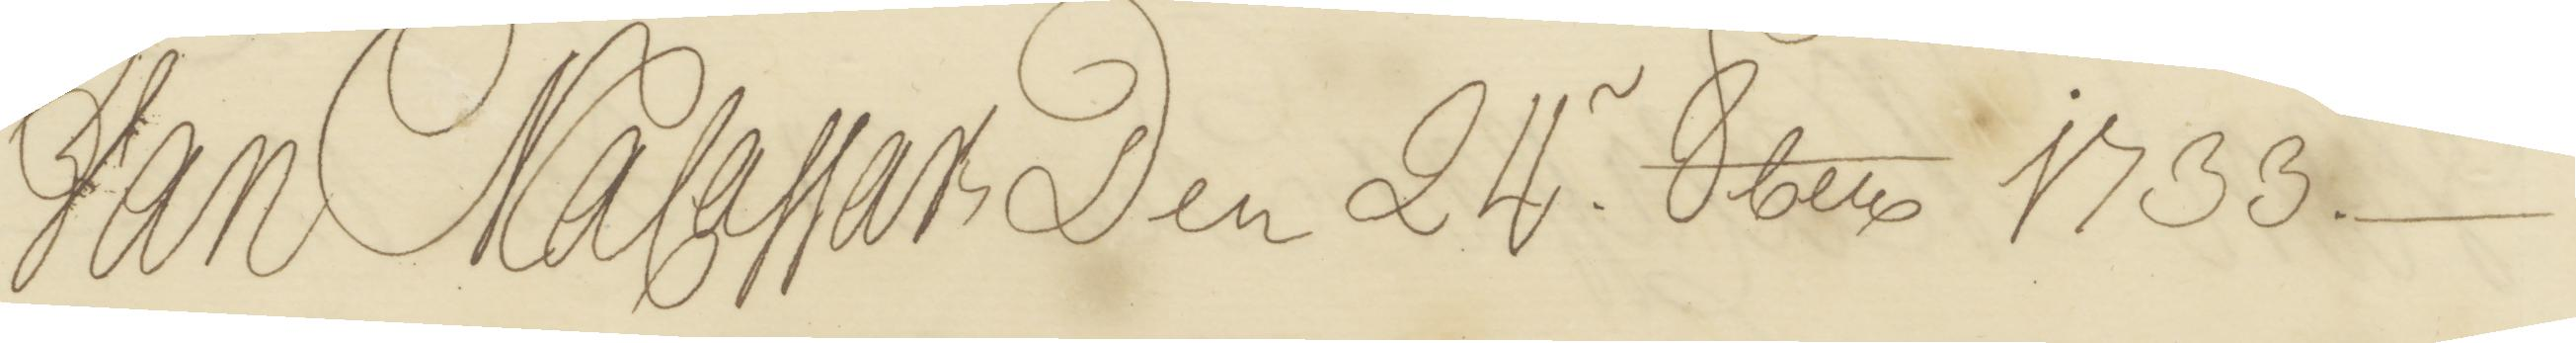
Van Macassar Den 24.' 8ber 1733.—
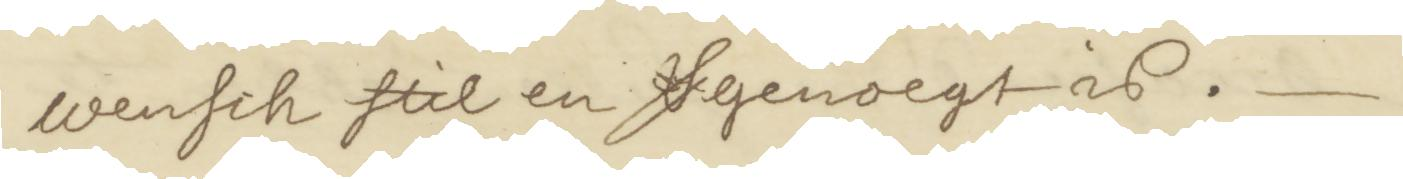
wensch stil en vergenoegt is. —
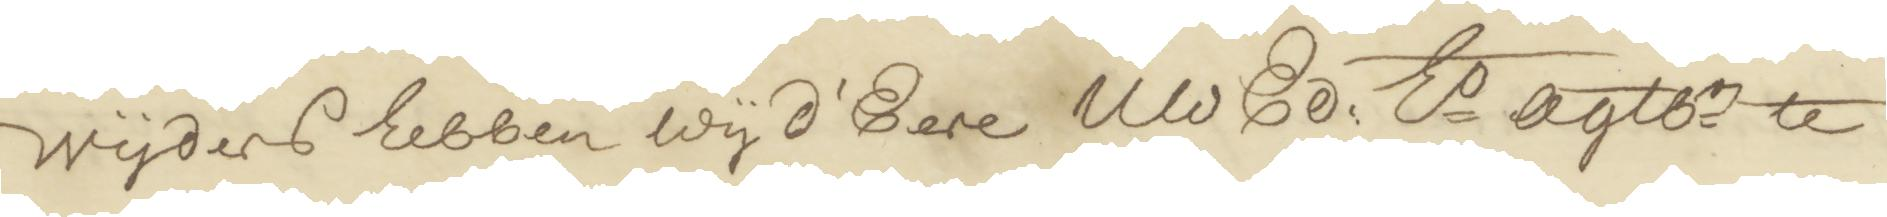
wijders hebben wij d’ Eere uw Ed: h=o agtb=n te
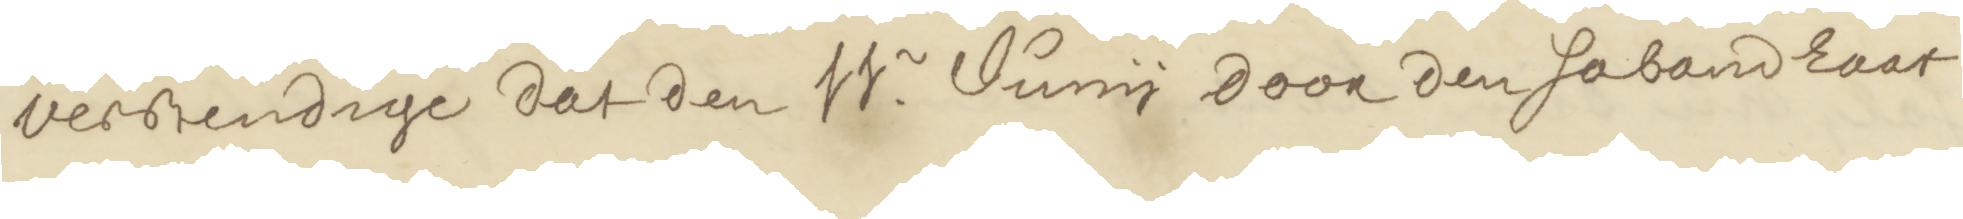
verstendige dat den 11.' Junij door den soband haar
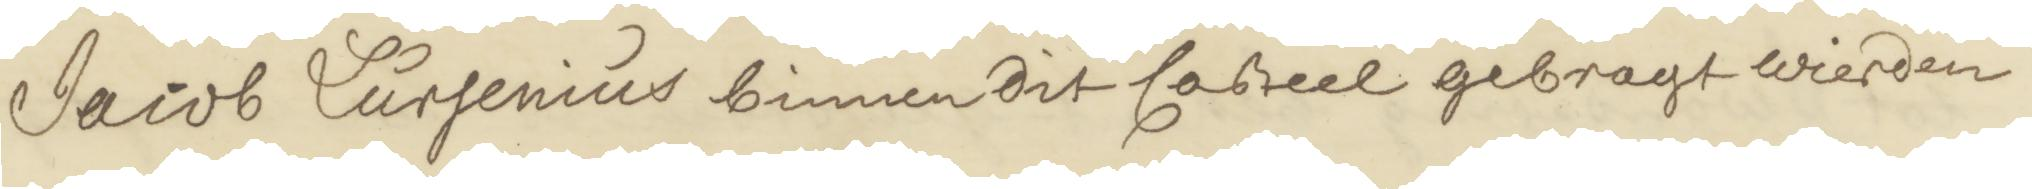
Iacob Lursenius binnen dit Casteel gebragt wierden
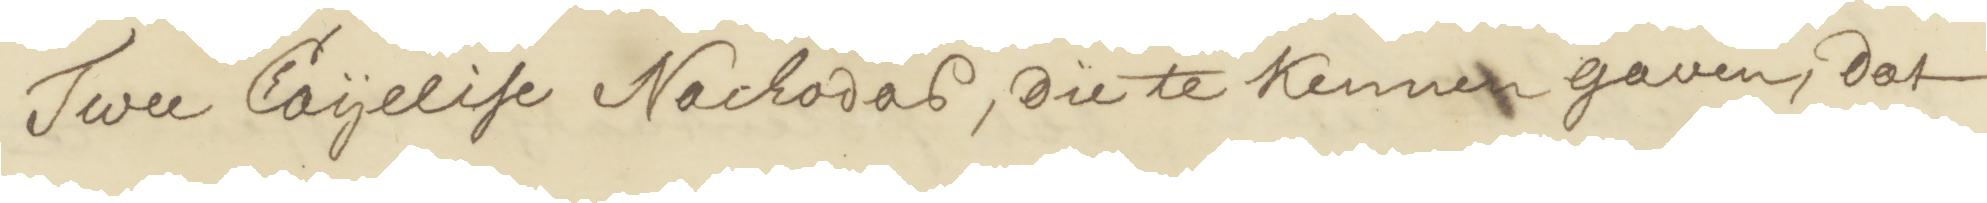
Twee Caijelise Nachodas, die te kennen gaven, dat
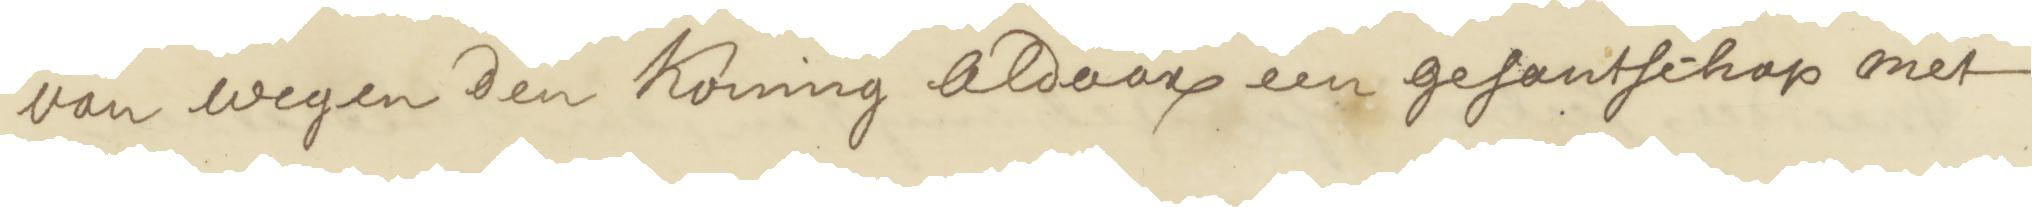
van wegen den koning aldaar een gesantschap met
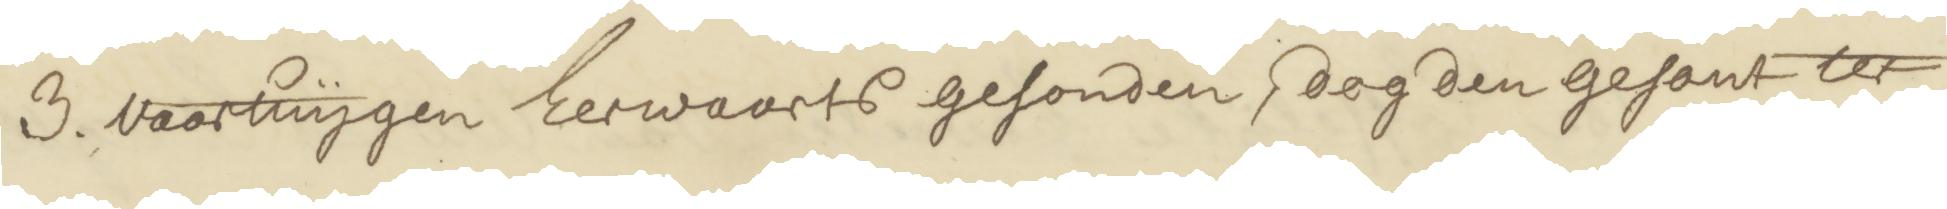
3. vaartuijgen herwaarts gesonden, dog den gesant ter
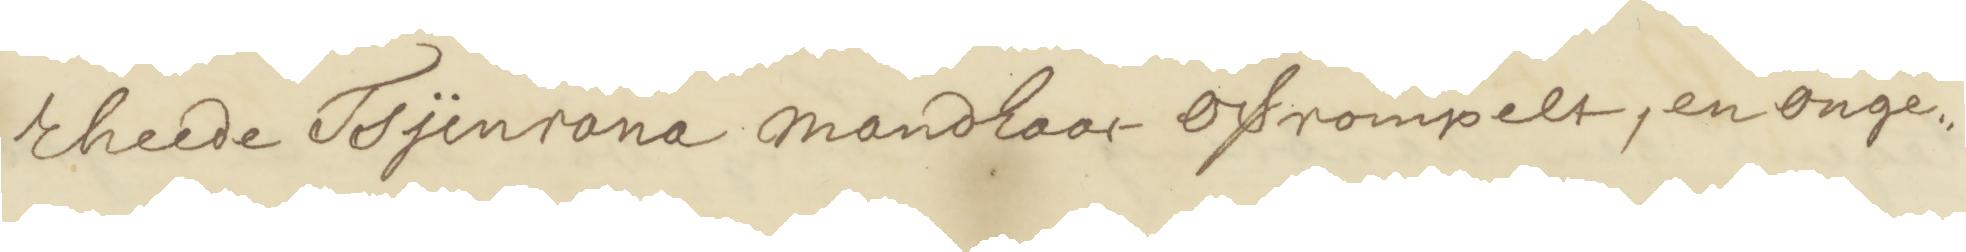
rheede Tsjinrana mandhaar overrompelt, en onge„
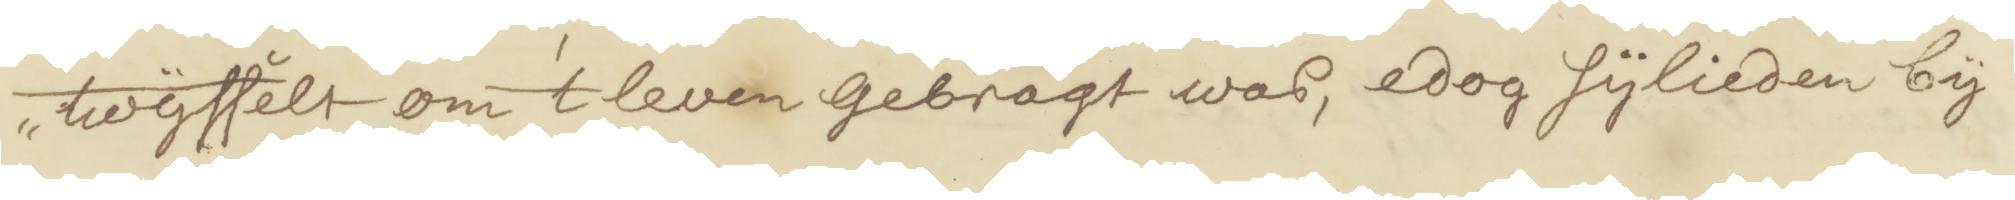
„twijffelt om ’t leven gebragt was, edog sijlieden bij
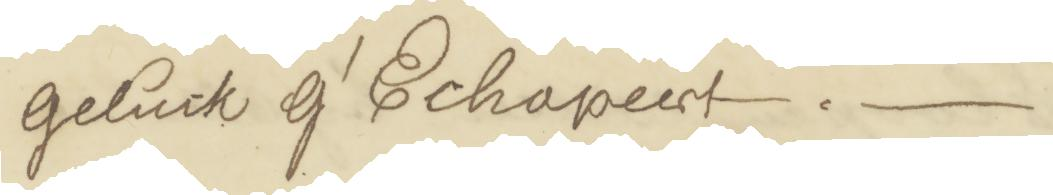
geluck g’Echapeert. —
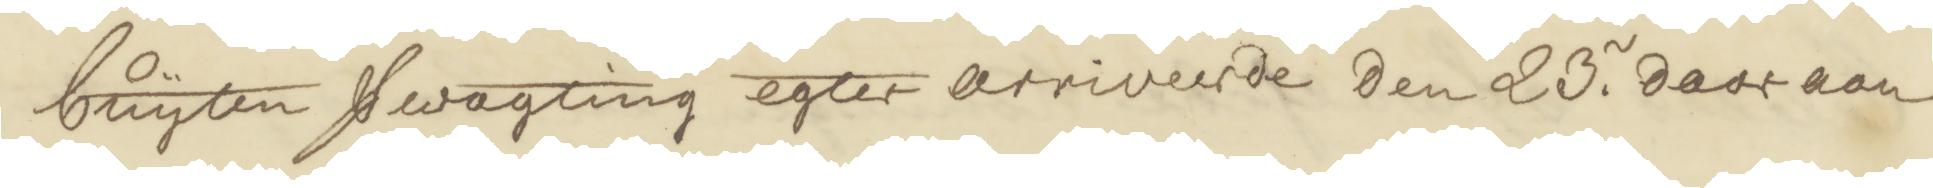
buijten verwagting egter arriveerde den 23.' daar aan
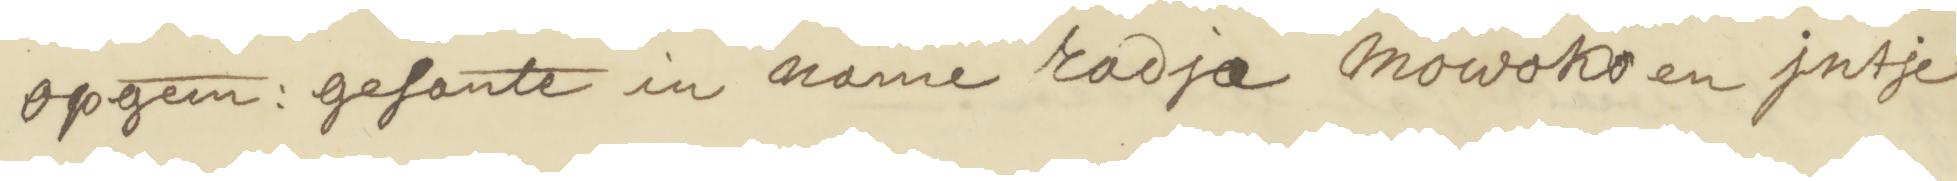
op gem: gesante in name radja mowoko en jntje
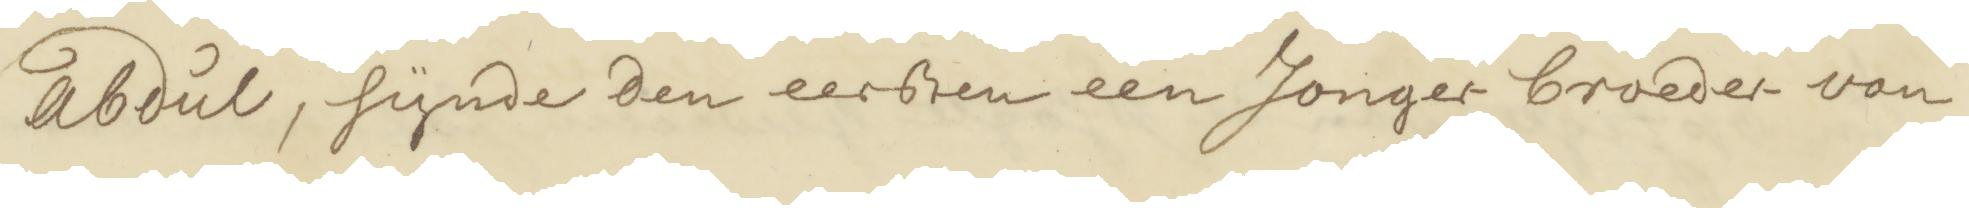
abdul, sijnde den eersten een Jonger broeder van
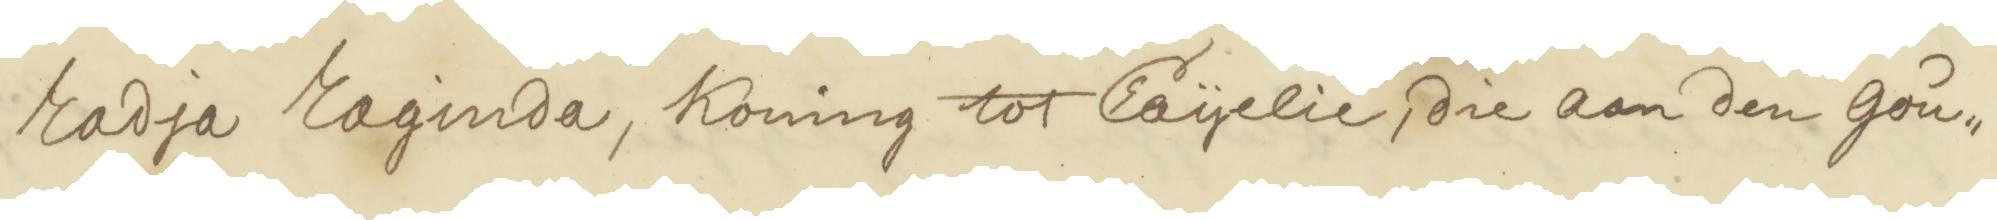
radja raginda, koning tot Caijelie, die aan den gou„
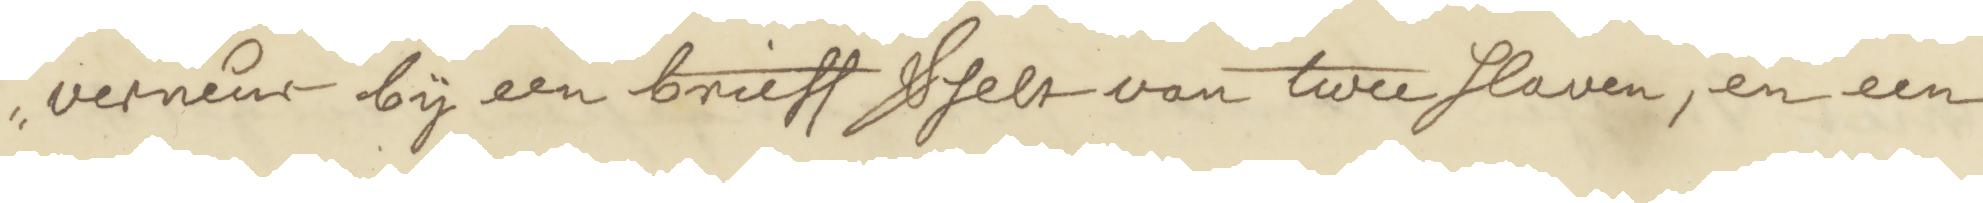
„verneur bij een brieff verselt van twee slaven, en een
